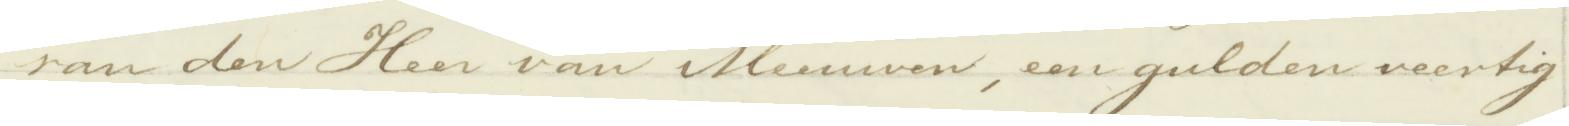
van den Heer van Meeuwen, een gulden veertig
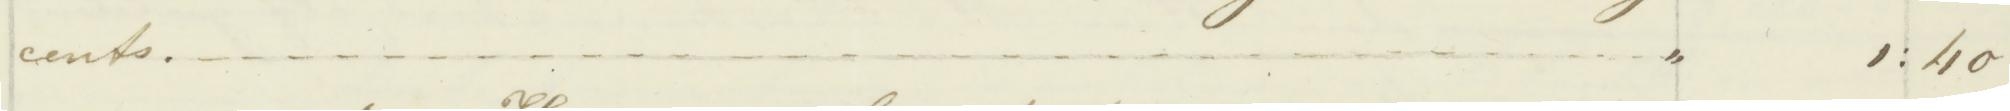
cents. - - - - - - - - - - - - - - - - - - - - - - - - - - - - - - - - „ 1: 40
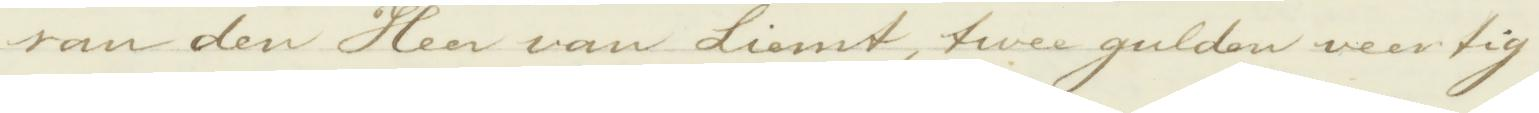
van den Heer van Liemt, twee gulden veertig
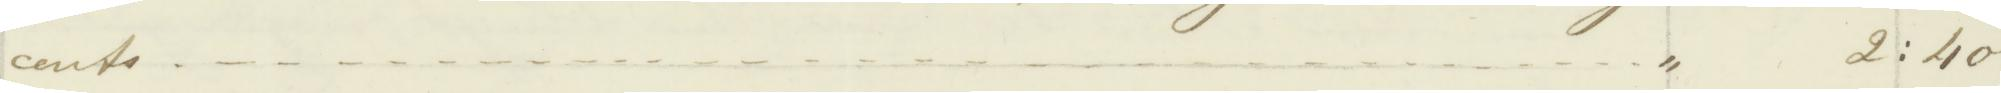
cents. - - - - - - - - - - - - - - - - - - - - - - - - - - - - - - - „ 2: 40
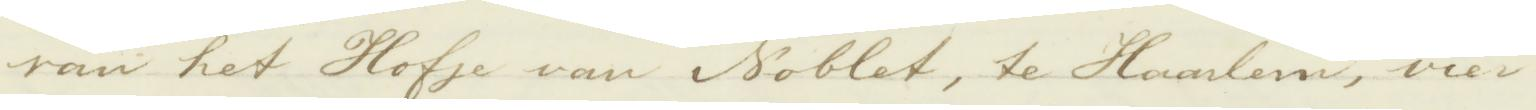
van het Hofje van Noblet, te Haarlem, vier
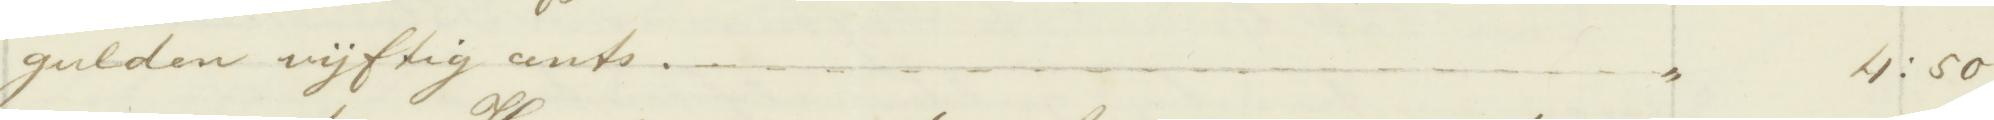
gulden vijftig cents. - - - - - - - - - - - - - - - - - -„ 4: 50
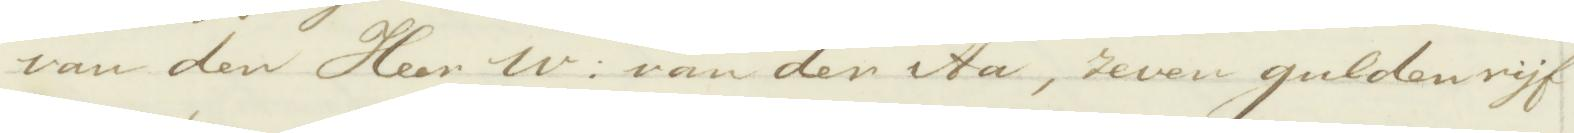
van den Heer W: van der Aa, zeven gulden vijf
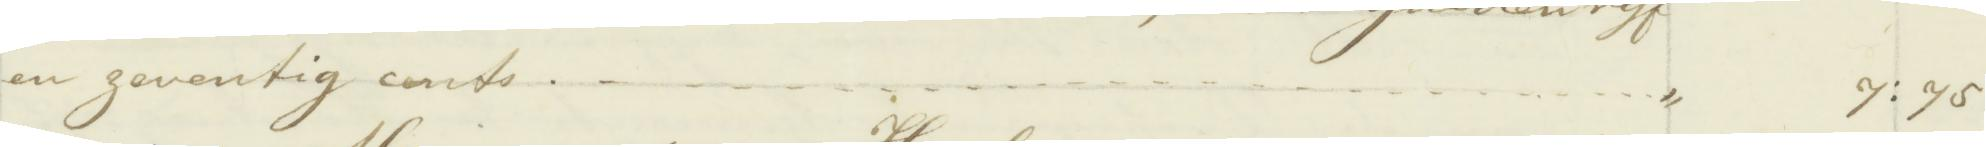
en zeventig cents. - - - - - - - - - - - - - - - - - - - - - - - - - „ 7: 75
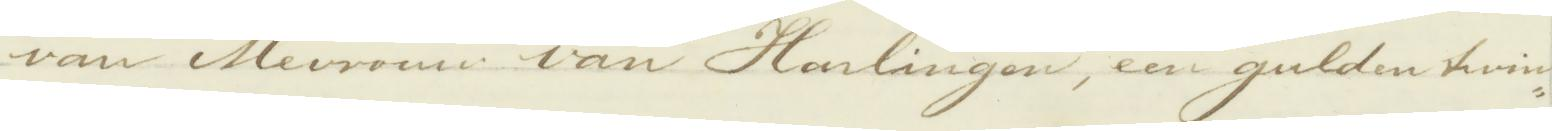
van Mevrouw van Harlingen, een gulden twin„
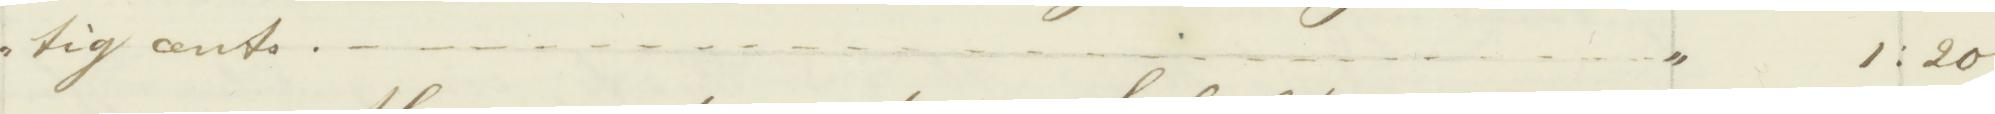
„tig cents. - - - - - - - - - - - - - - - - - - - - - - - . . . . „ 1: 20
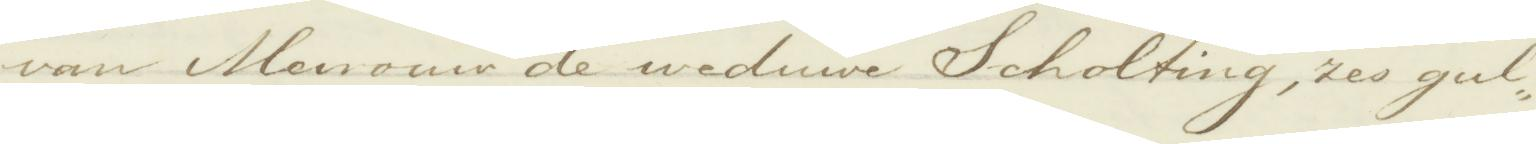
van Mevrouw de weduwe Scholting, zes gul„
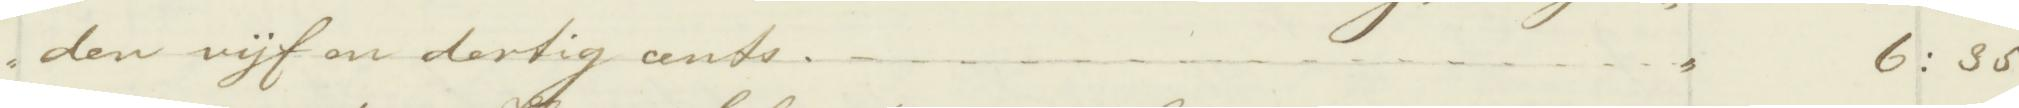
„den vijf en dertig cents. - - - - - - - - - - - - - - - - - -„ 6: 35
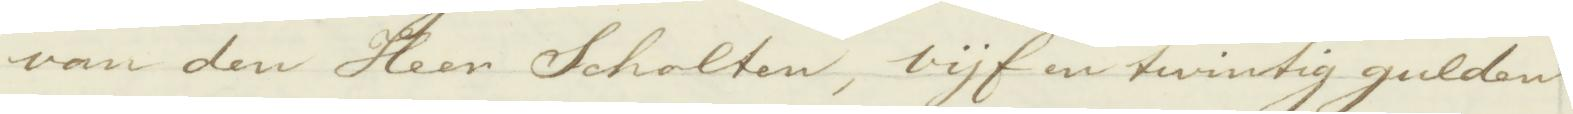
van den Heer Scholten, vijf en twintig gulden
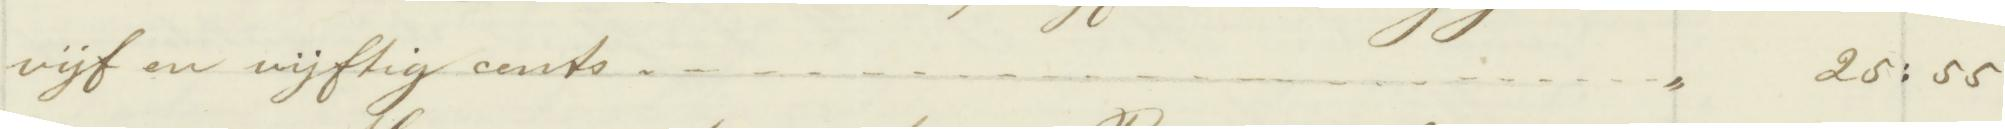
vijf en vijftig cents - - - - - - - - - - - - - - - - - - - - - - „ 25: 55
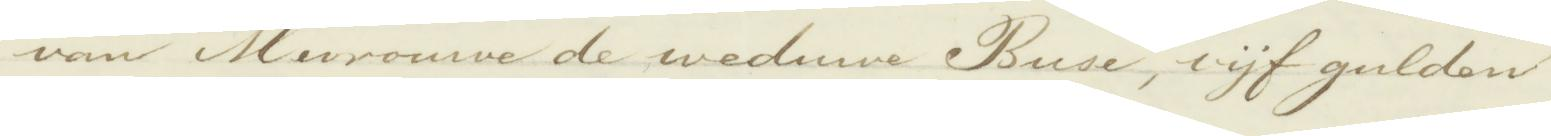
van Mevrouwe de weduwe Buse, vijf gulden
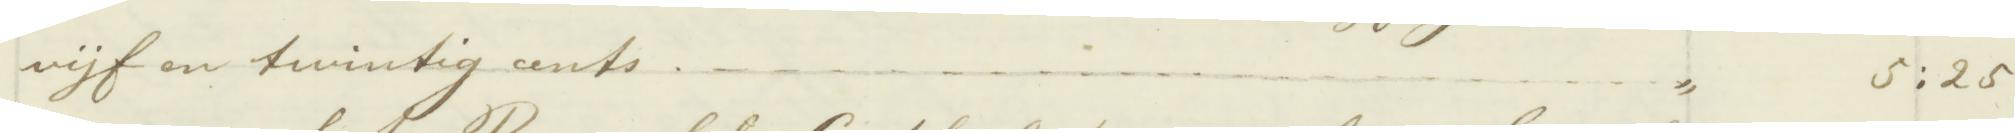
vijf en twintig cents . - - - - - - - - - - - - - - - - - - - - - „ 5: 25
